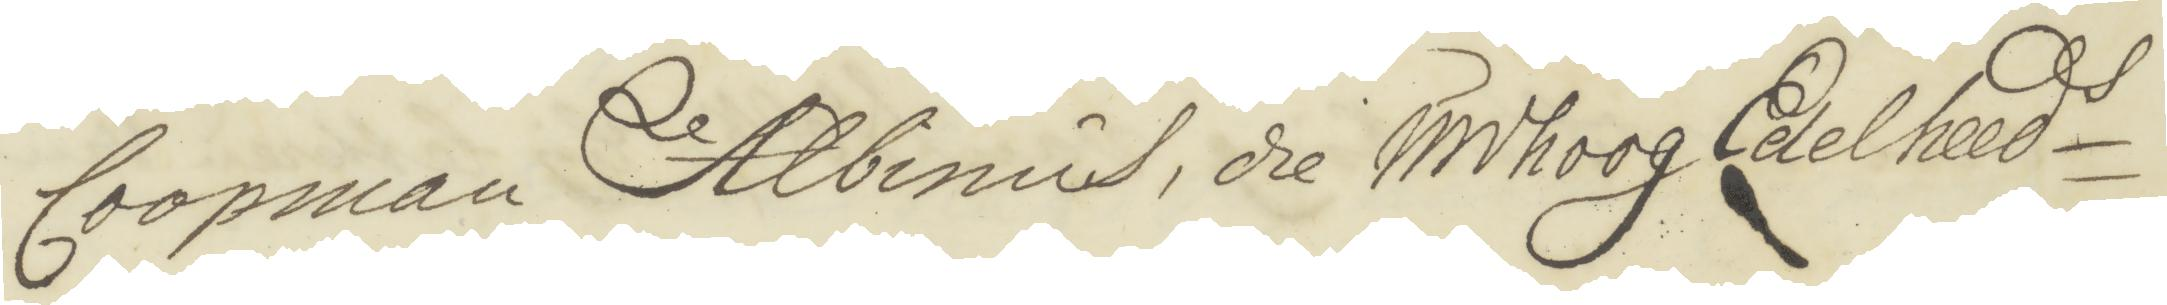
Coopman Albinus, die uwhoog Edelheed=s
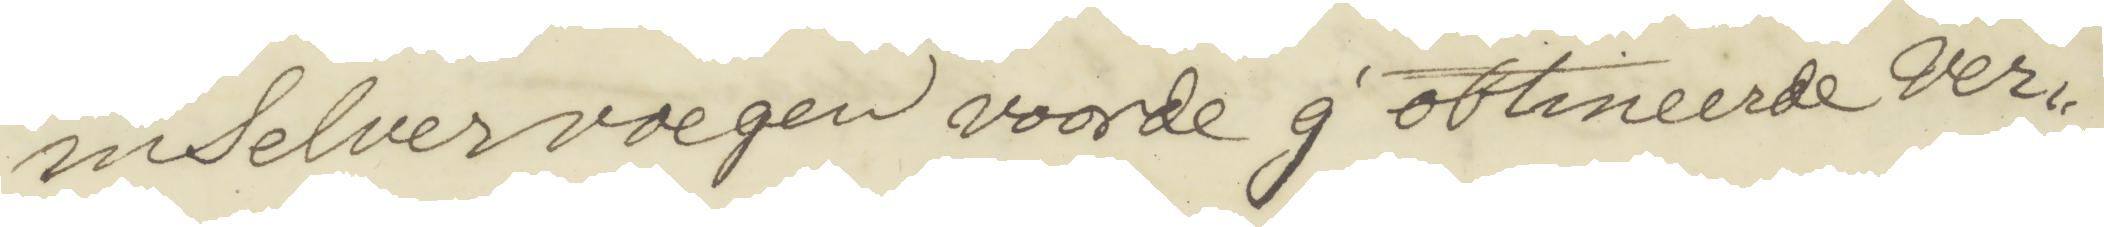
inselvervoegen voorde g’ obtineerde ver„
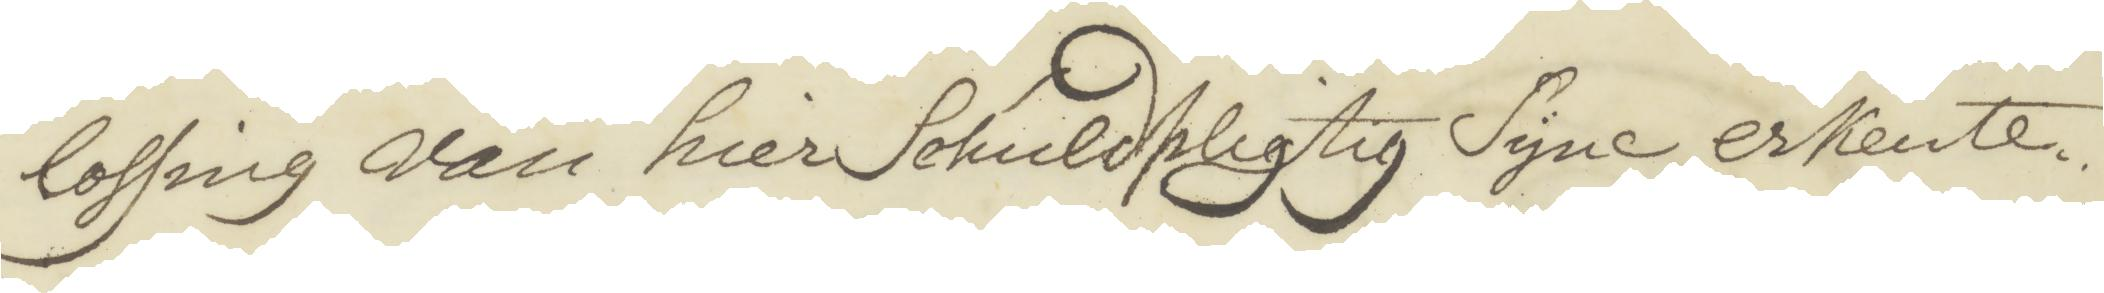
lossing van hier schuldpligtig sijne erkente„
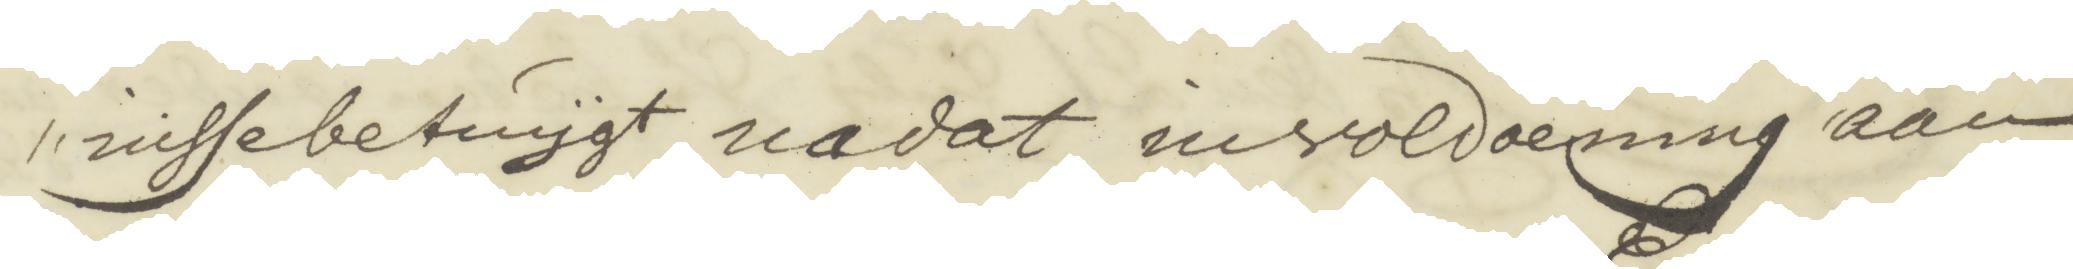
„nisse betuijgt nadat in voldoening aan
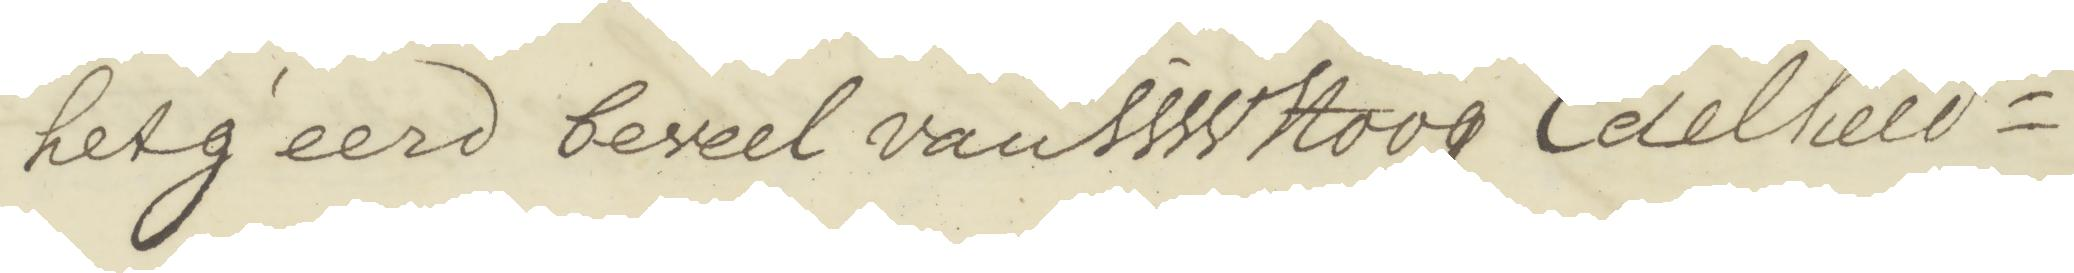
het g' eerd beveel van uw Hoog Edelheed=s
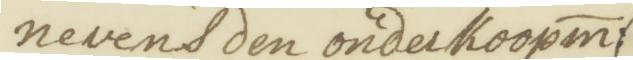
nevens den onderkoopm:
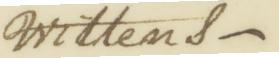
wittens —
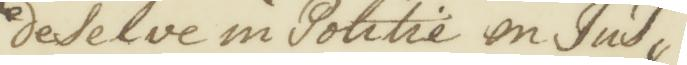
deselve in Politie en Ius„
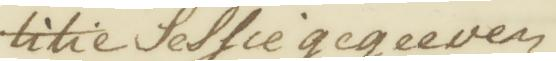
titie sessie gegeeven
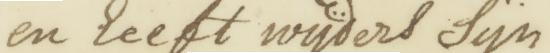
en heeft wijders sijn
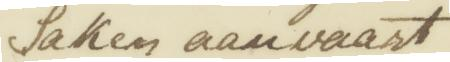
saken aanvaart
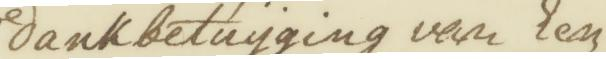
dank betuijging van hem
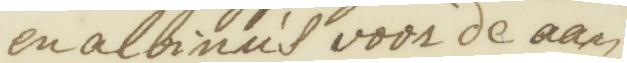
en albinus voor de aan
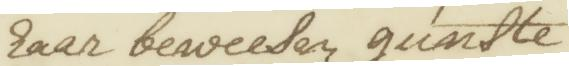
haar beweesen gunste
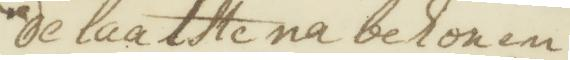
de laatste na behoren
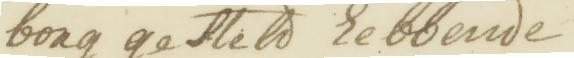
borg gesteld hebbende
